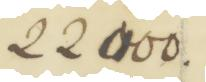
22000.
